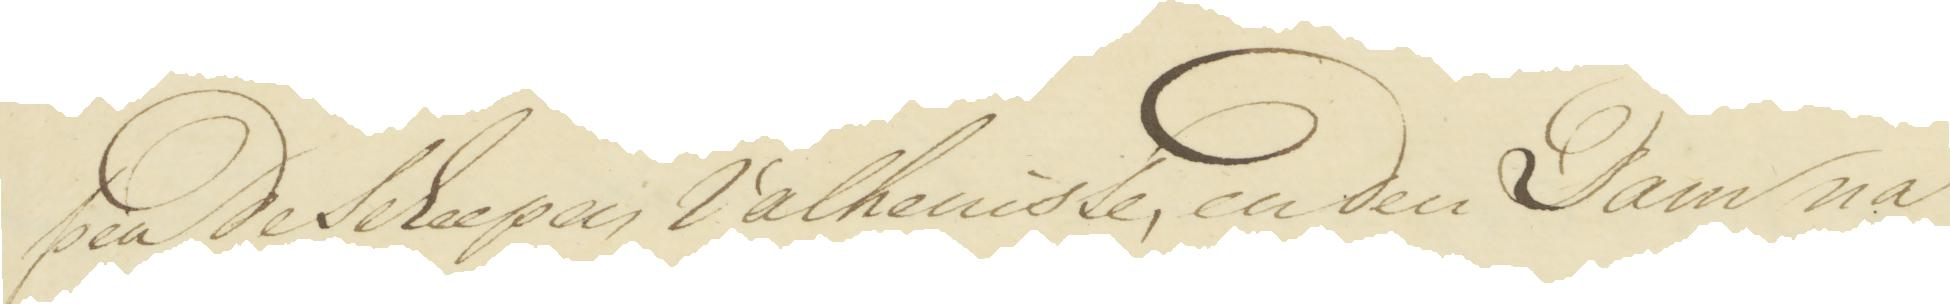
per de scheepen Valkenisse, en den Dam na
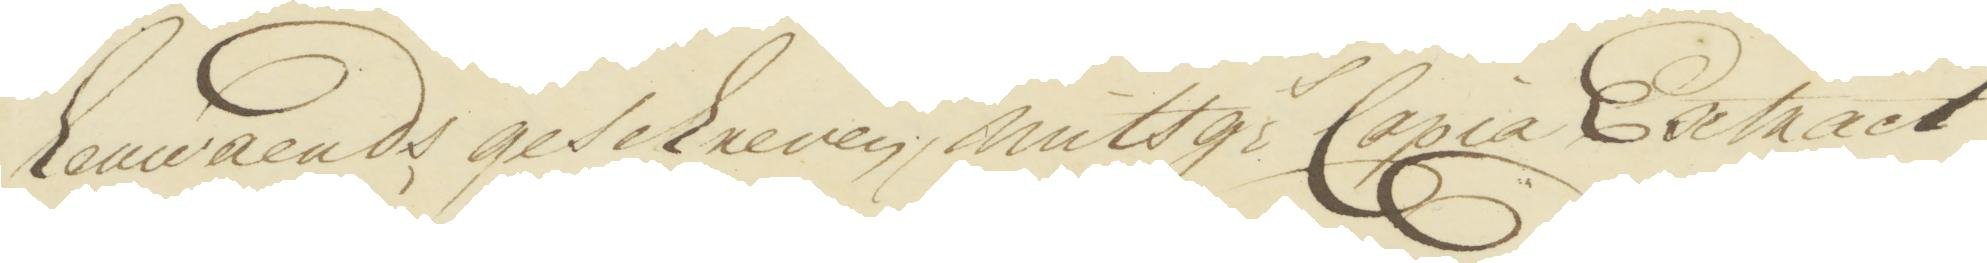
herwaerds geschreven, mitsg:s Copia Extract
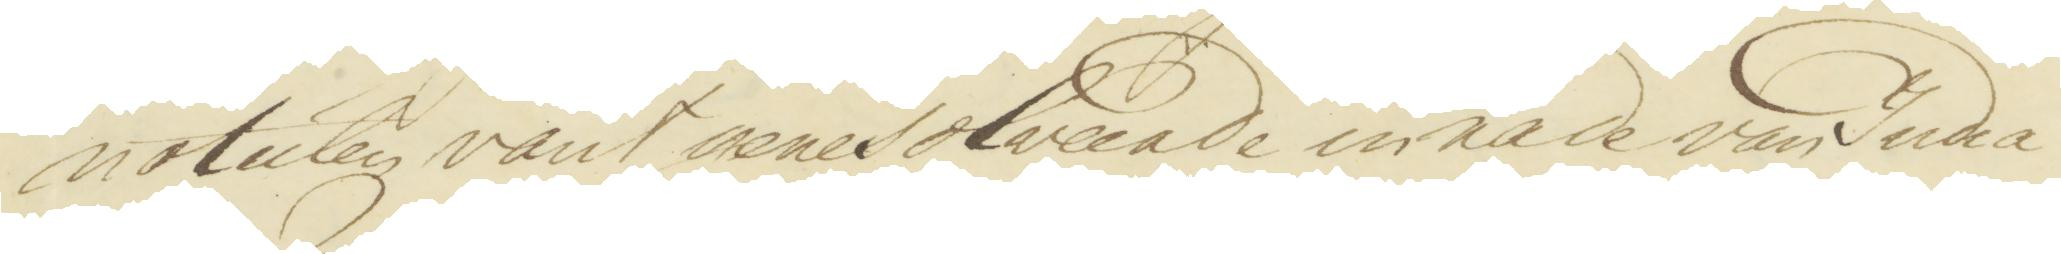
notulen van’t geresolveerde in rade van India
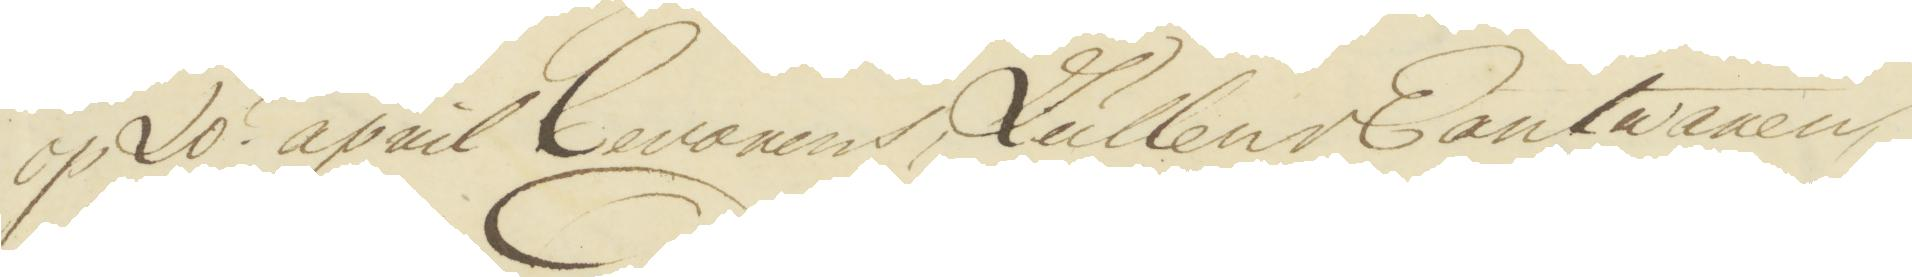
op 20.' april bevorens, zullen vE ontwaren,
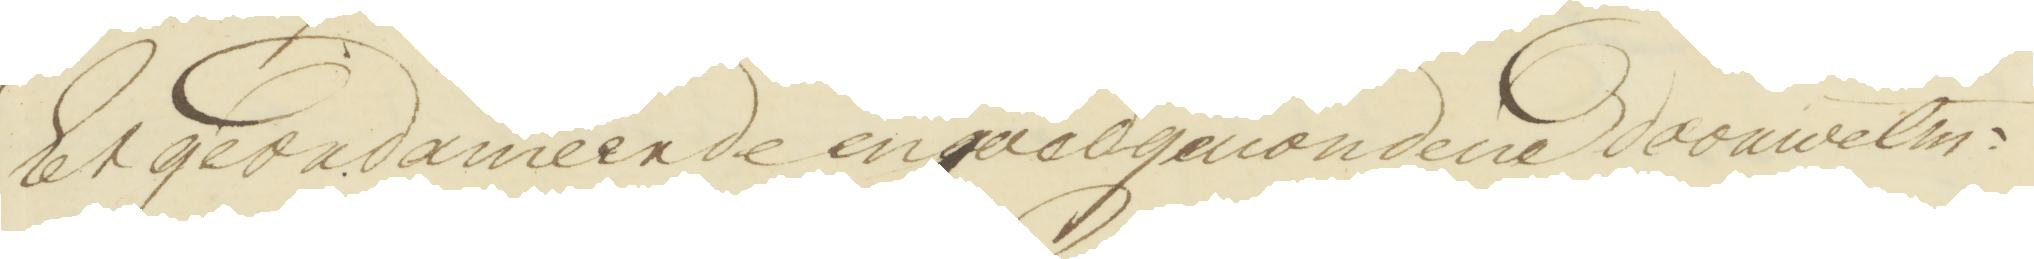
het geordameerde en goedgevondene doorwelm:
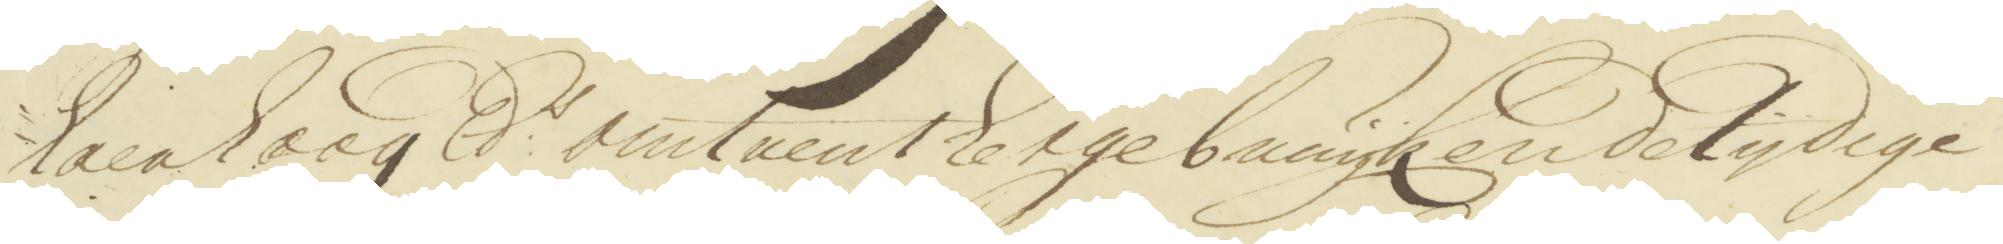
haer hoog Ed:s omtrent het gebruijk en de tijdige
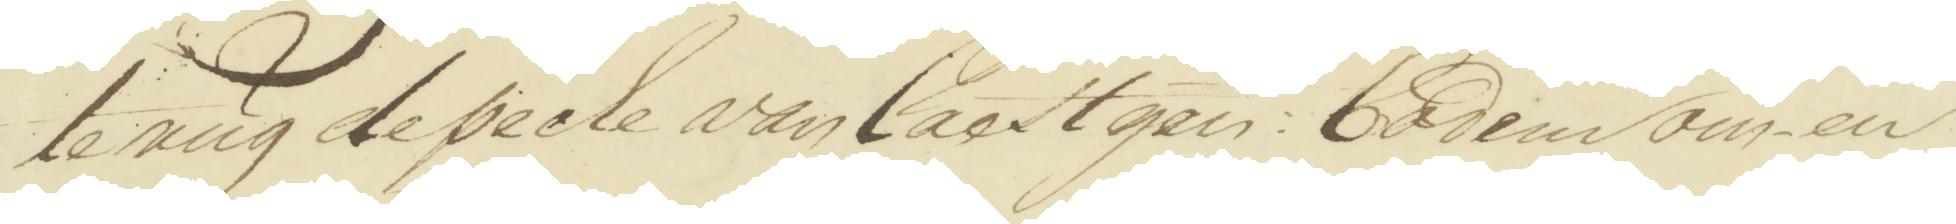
terug depeche van laast gen: bodem om en
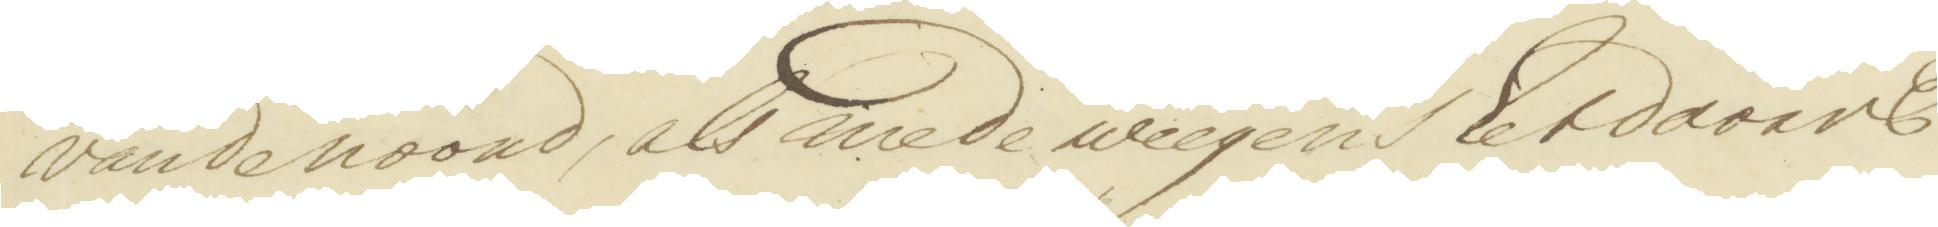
van de noord, als mede weegens het door vE
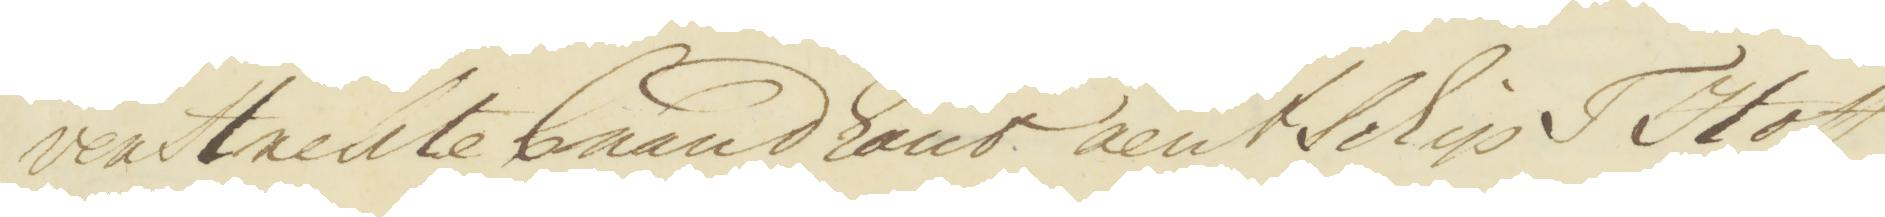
verstrekte brandhout aen 't schip T Hoff
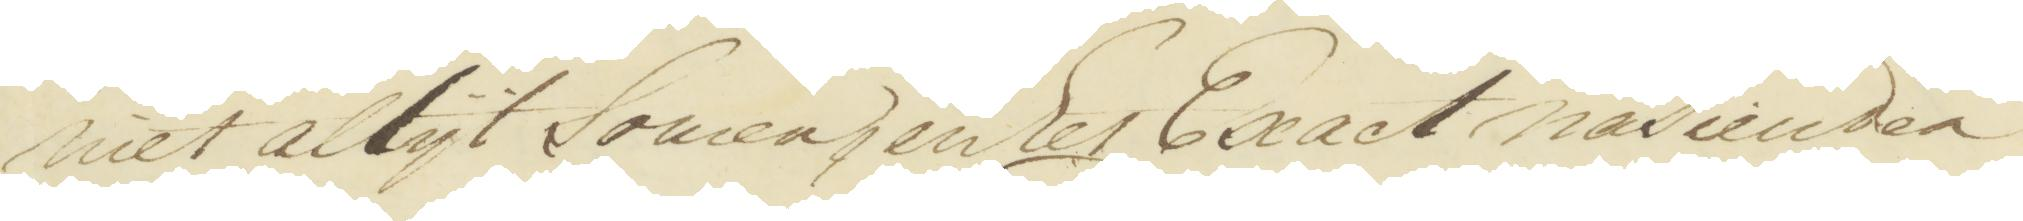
niet altijt somer, en het Exact nasiender
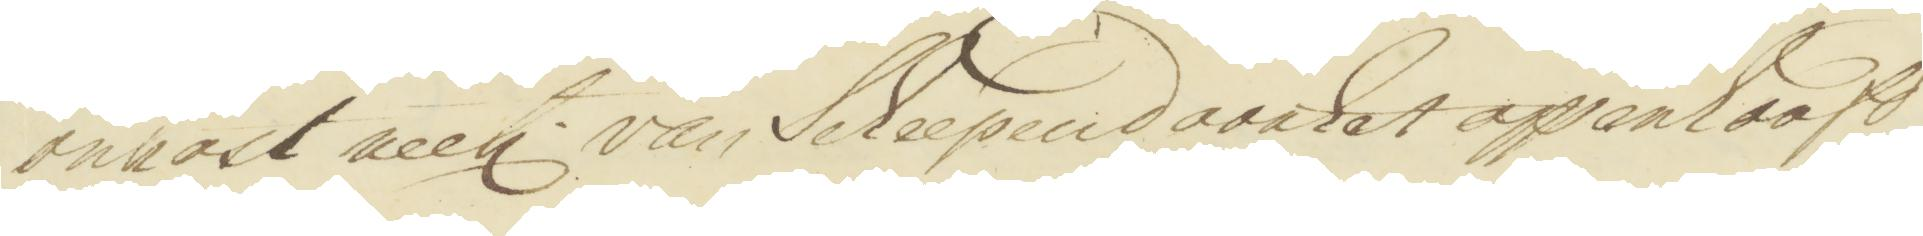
onkost reek: van scheepen door het opperhoofd
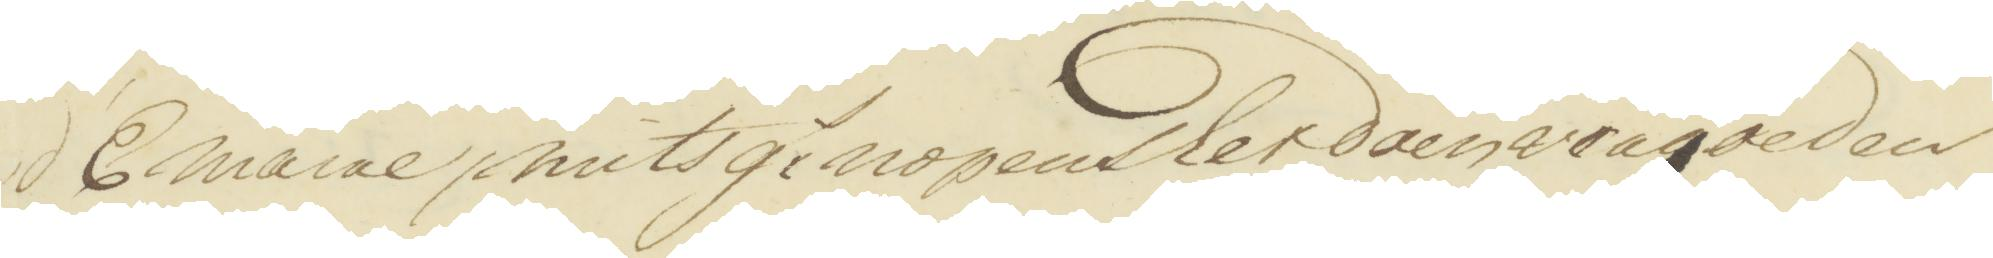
d’E maire, mitsg:s nopens het doen vergoeden
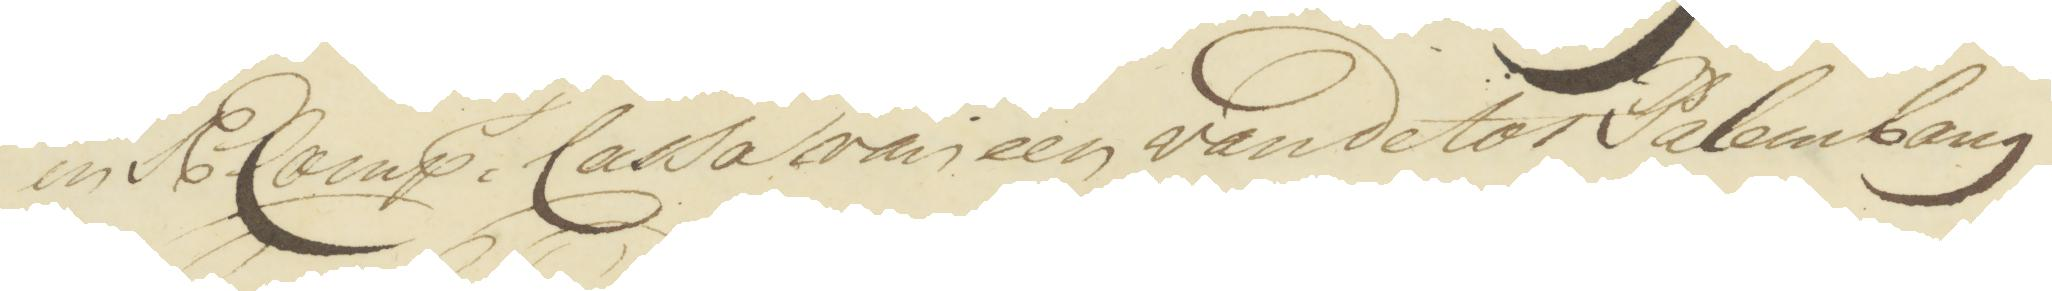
in 's E Comp:s Cassa van een van de tot Palembang
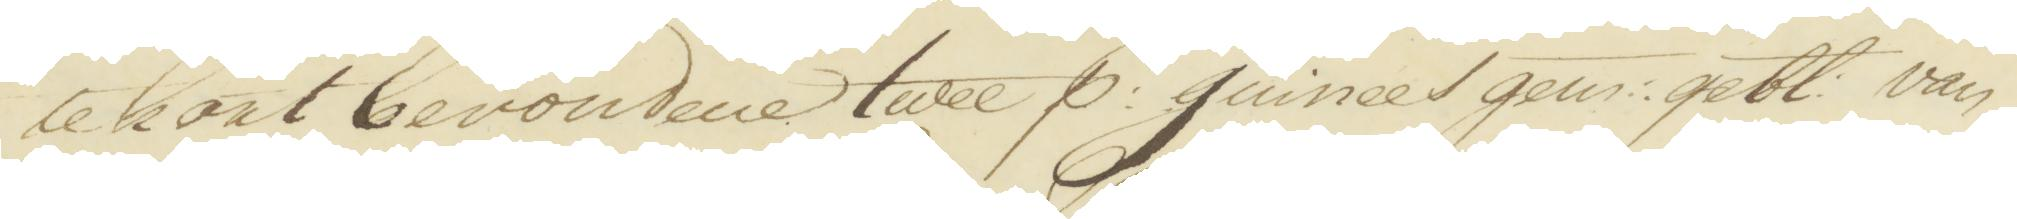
te kort bevondene twee p:s guinees gem: gebl: van
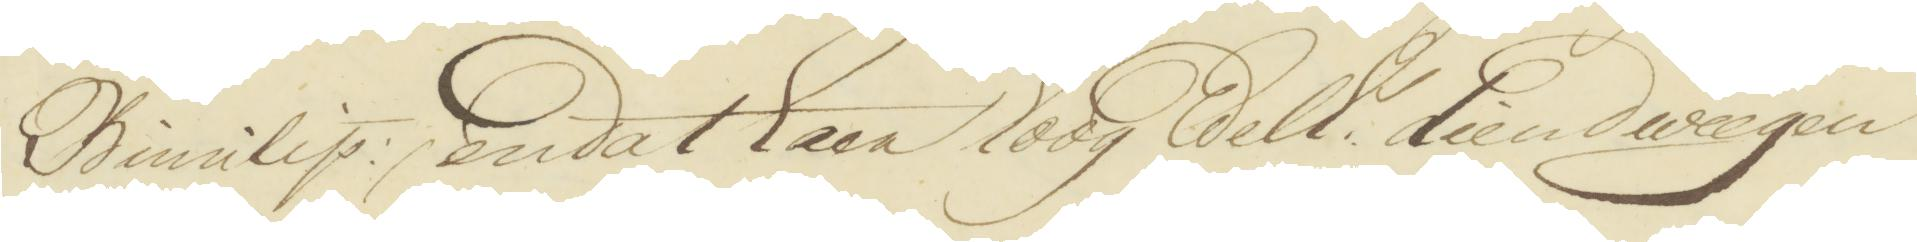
Bimilip:, en dat haer hoog Edelh:s dien dweegen
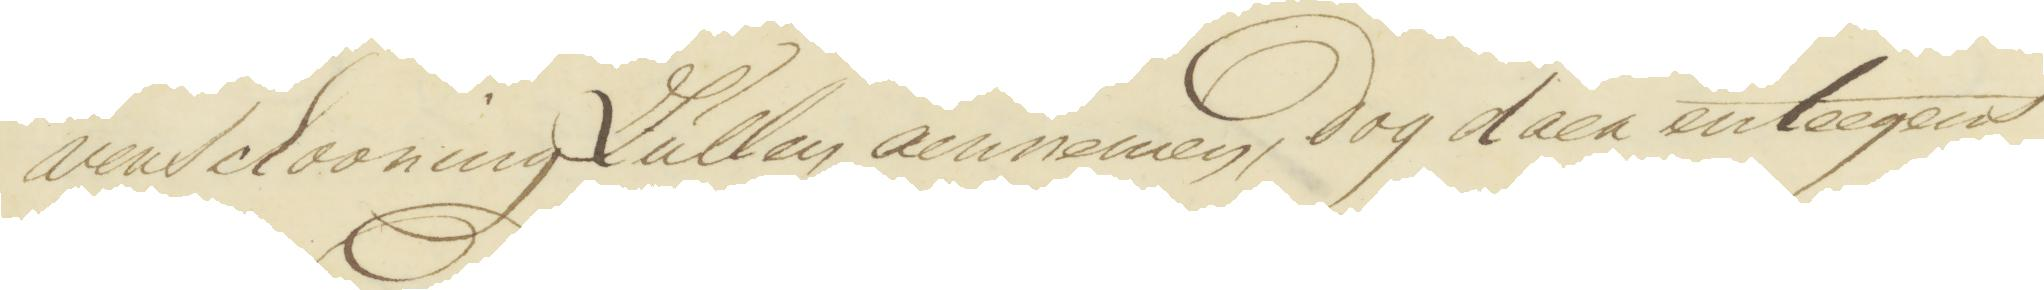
verschooning zullen aennemen, dog daer enteegens
